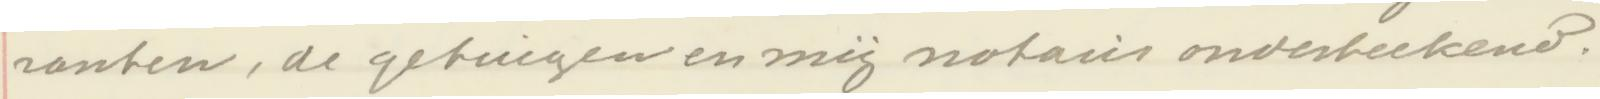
ranten, de getuigen en mij notaris onderteekend.
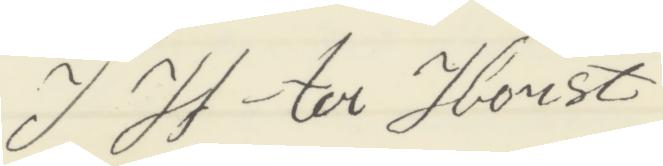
I H ter Horst
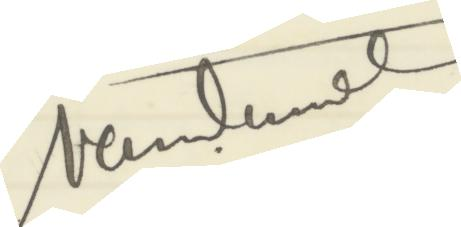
vanhamel
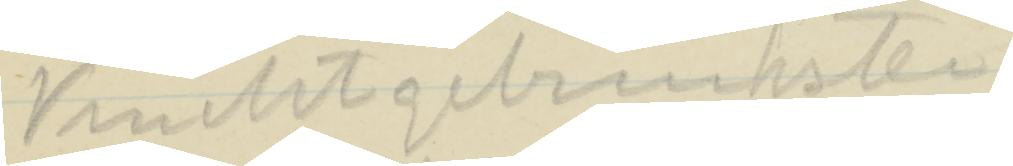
Vruchtgebruikster
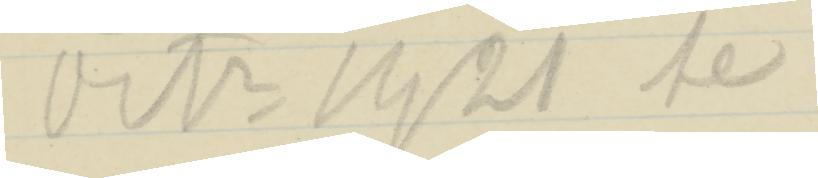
11 oct-r 1921 te
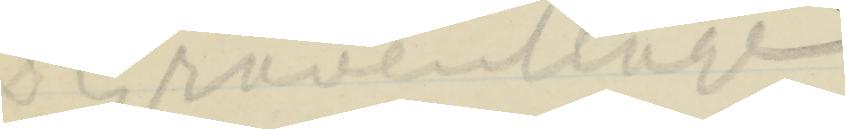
's Gravenhage
